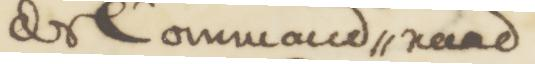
des Command„s raad
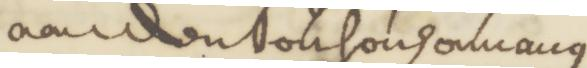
aan den Sousouhounang
